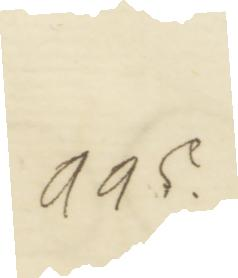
445.
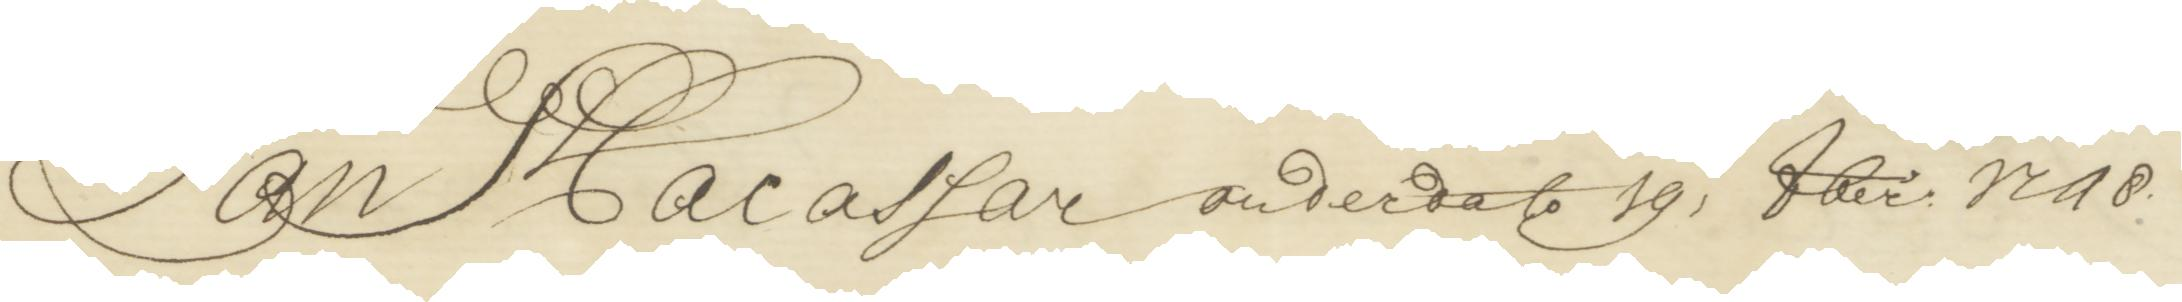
Van Macassar onderdato 19,' 7ber: 1748.
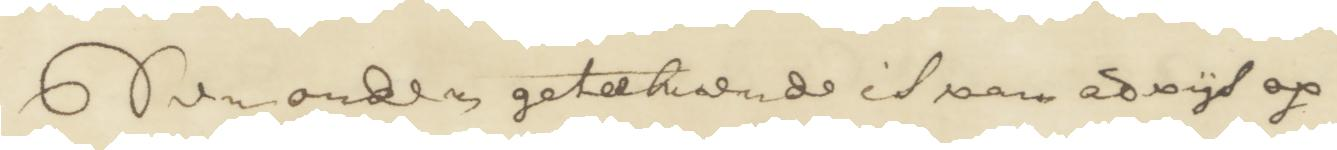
den onder geteekende is van advijs op
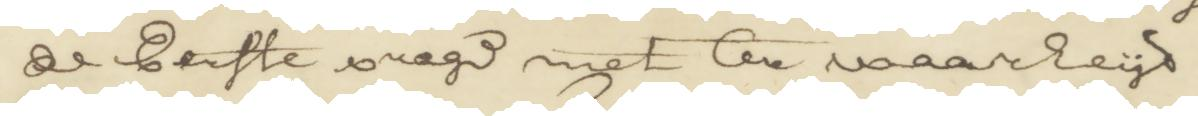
de Eerste vrage met ter waarheijd
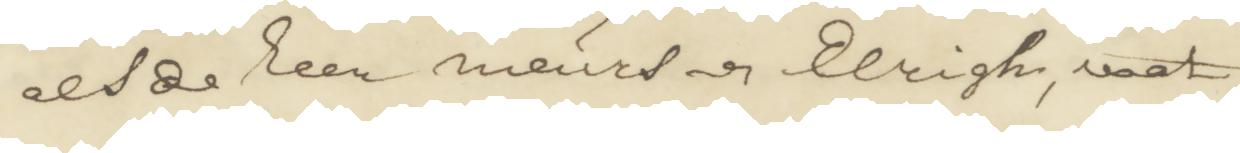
als de heer meurs en Elrigh, wat
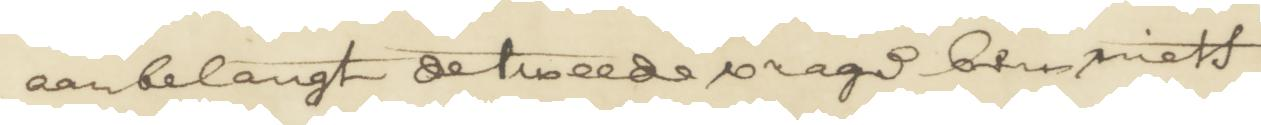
aanbelangt de tweede vrage ben niets
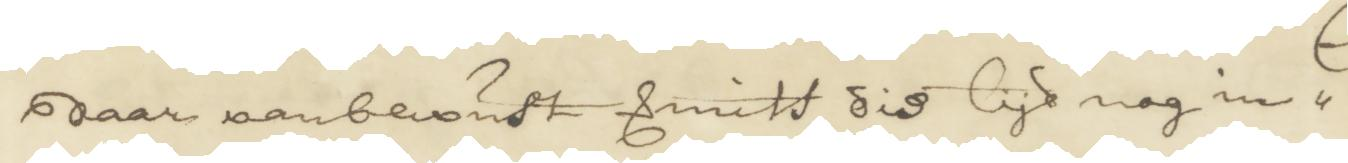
daar van bewust vermits die tijd nog in„
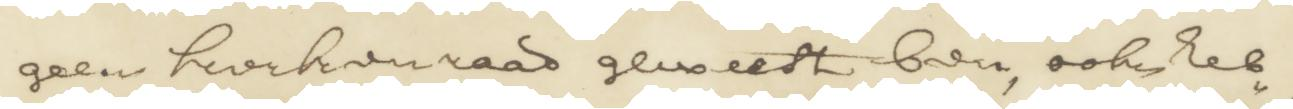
geen kerkenraad geweest ben, ook heb„
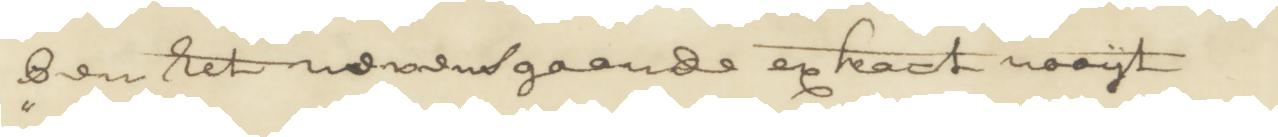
„ben het nevensgaande extract nooijt
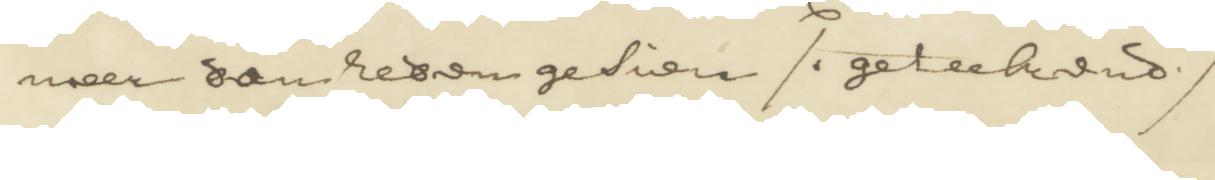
meer dan heden gesien /. geteekend./
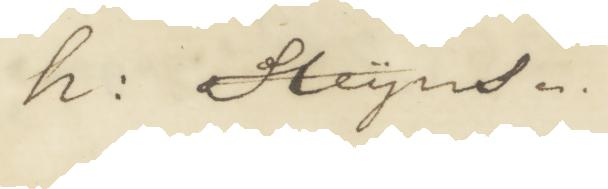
h: Steijns~.
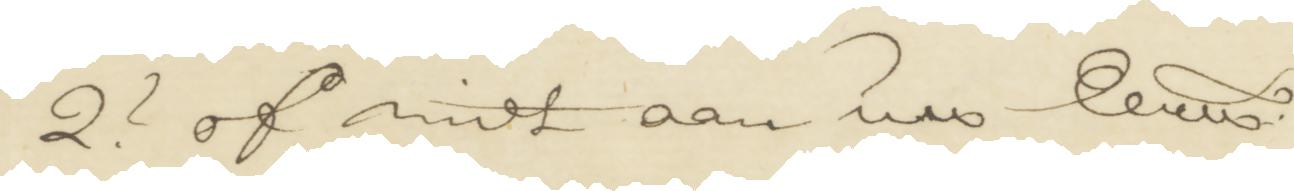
2.' of niet aan uw Eerw:
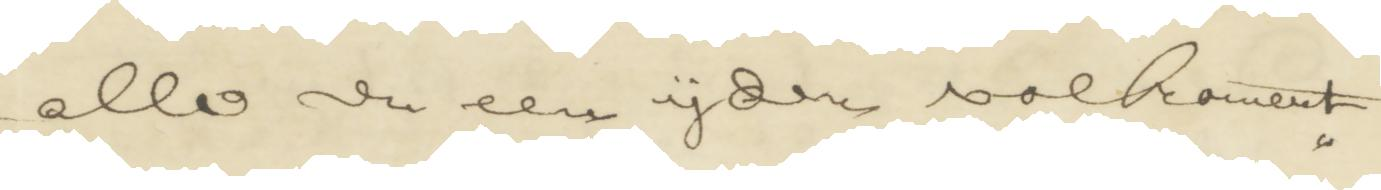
alle en een ijder volkoment„
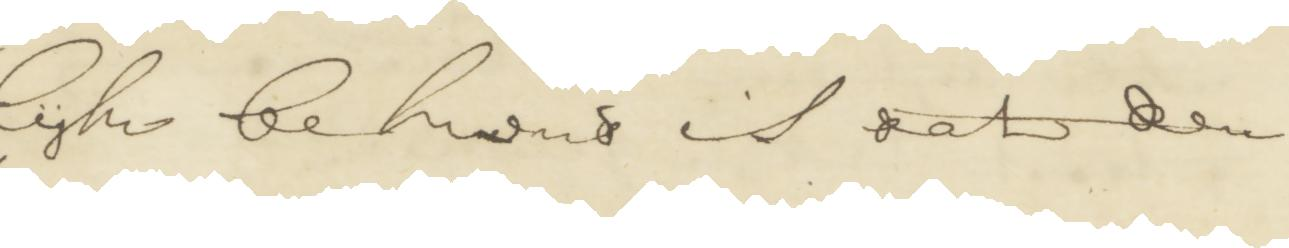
lijk bekend is dat den
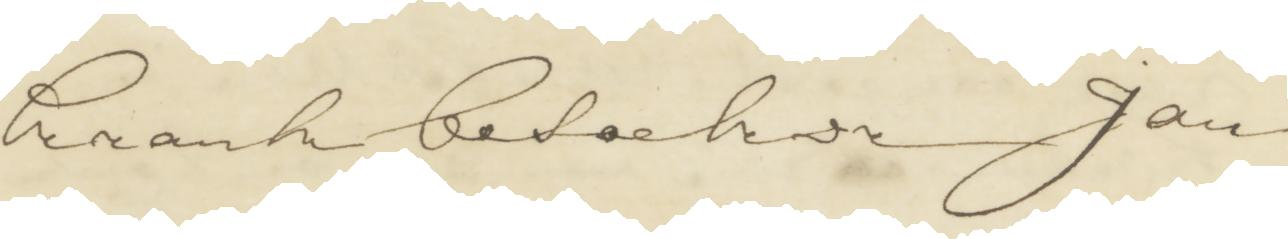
krank besoeker Jan
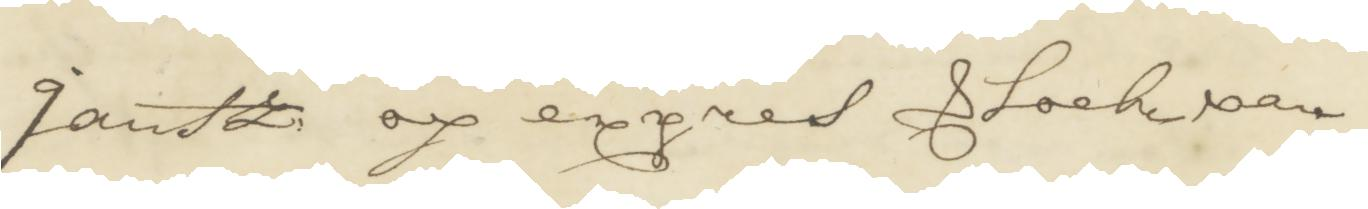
Jansz: op expres versoek van
